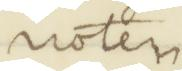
2: „ noten
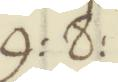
9: 8:
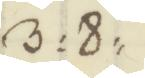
3:8„
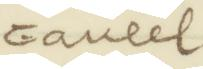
2: „ caneel
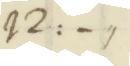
12: - „
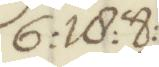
6:18:8
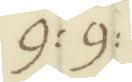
9: 9: 8:
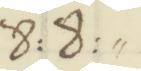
8:8:„
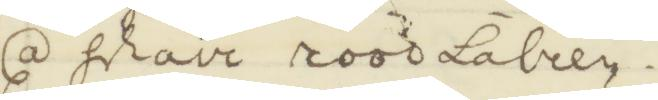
4. @ schair rood laken
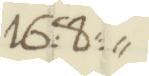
16: 8:„
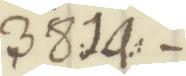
38:14: –
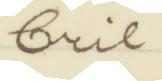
1: „ bril
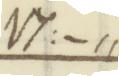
17:–„
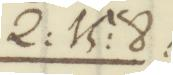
2: 15: 8
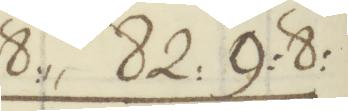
31:2:8:„ 82:9.8:
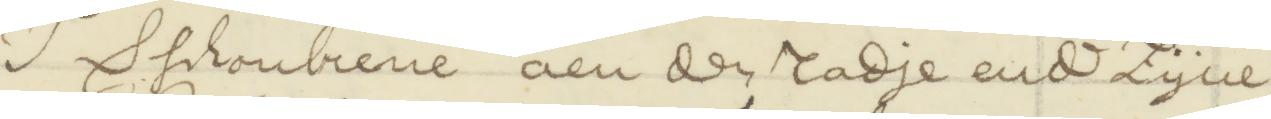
'T verschonkene aen den radje ende zijne
